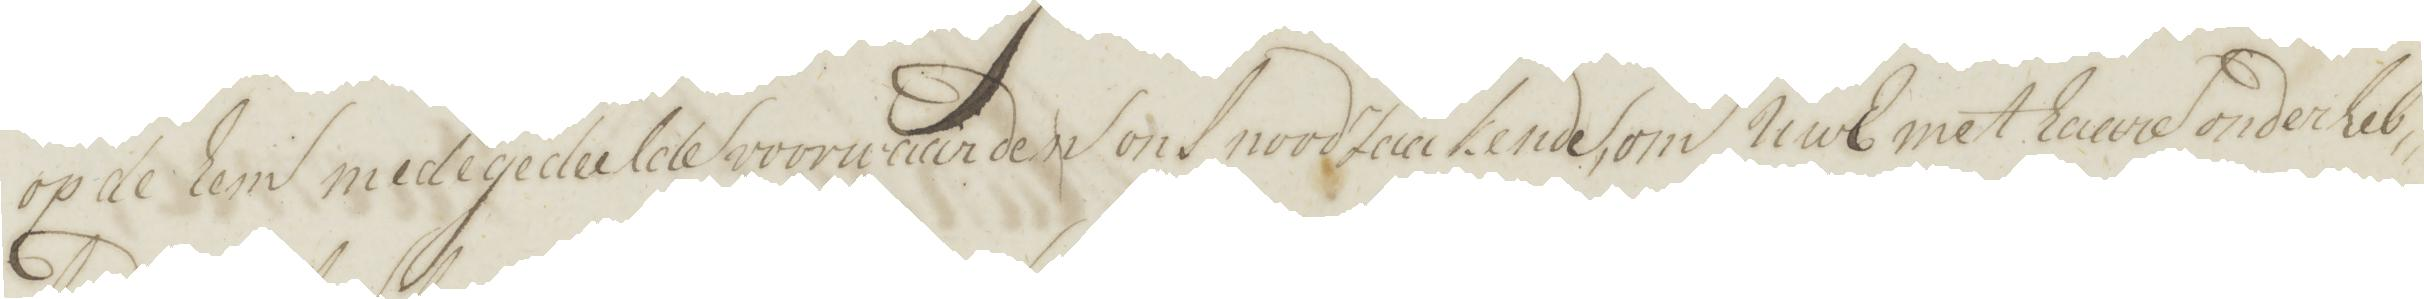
op de hem medegedeelde voorwaarden ons noodzaakende, om uwE met haare onder heb„
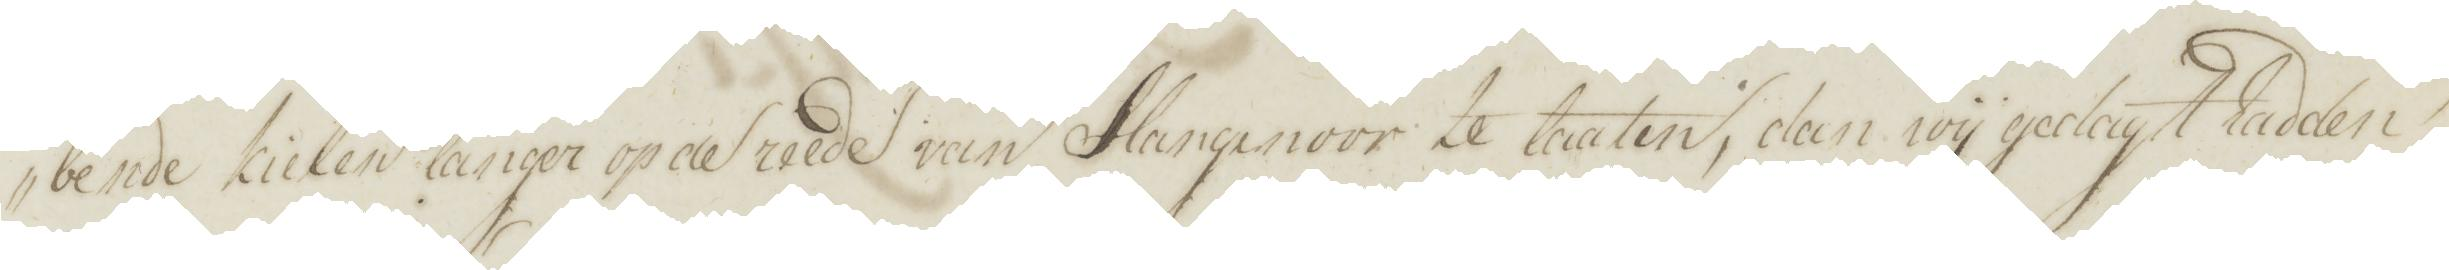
„bende kielen langer op de reede van Slangenoor te laaten, dan wij gedagt hadden,
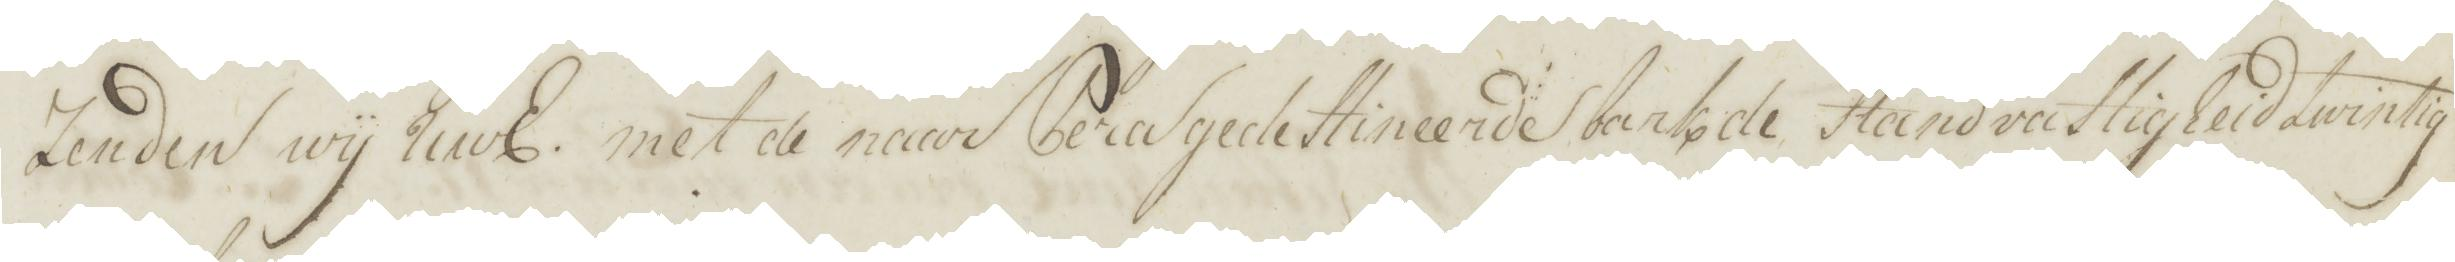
Zenden wij uwE. met de naar Pera gedestineerde bark de standvastigheid twintig
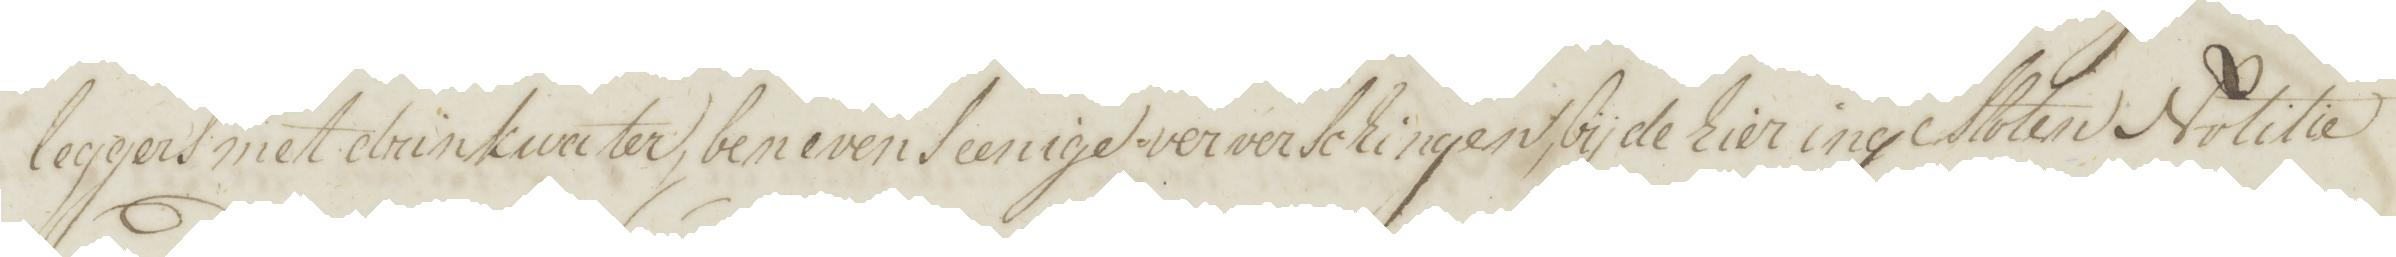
leggers met drinkwater, benevens eenige ververschingen, bij de hier ingesloten Notitie
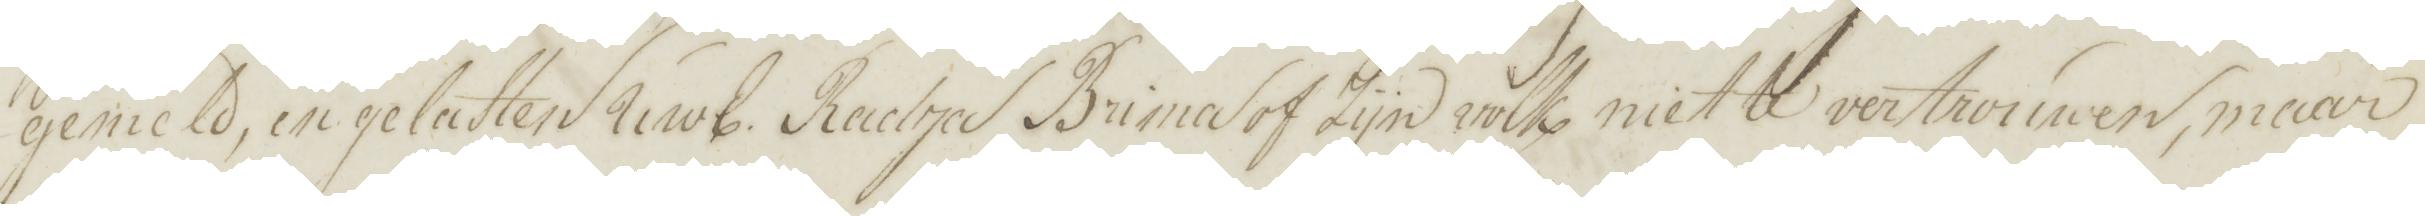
gemeld, en gelasten uwE. Radja Brima of Zijn volk niet te vertrouwen, maar
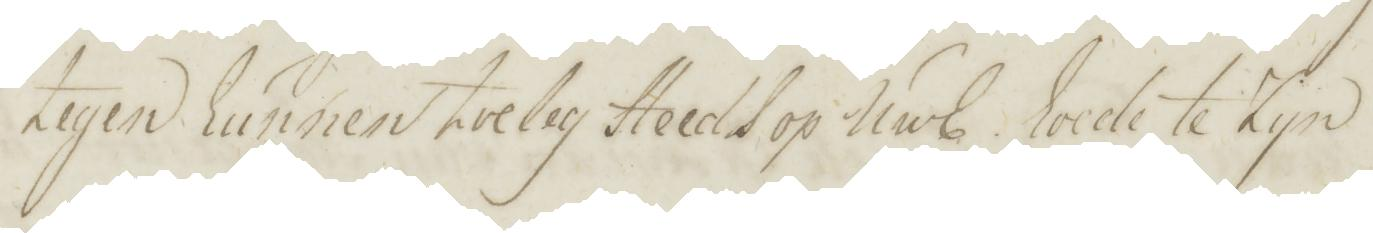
tegen hunnen toeleg steeds op uwE hoede te Zijn
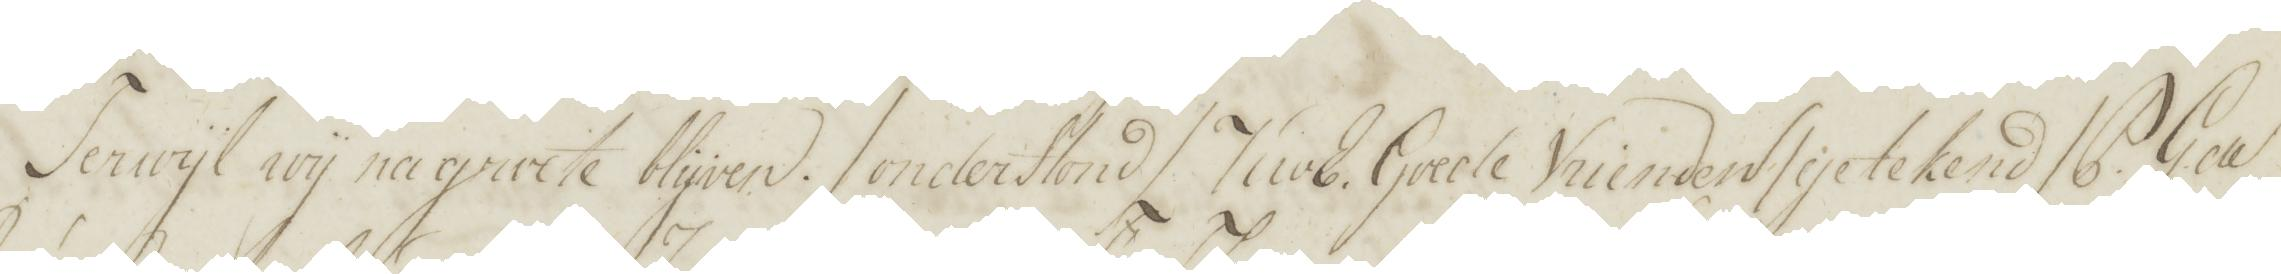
Terwijl wij na groete blijven /onder Stond/ uwE. Goede Vrienden /getekend /P. G de
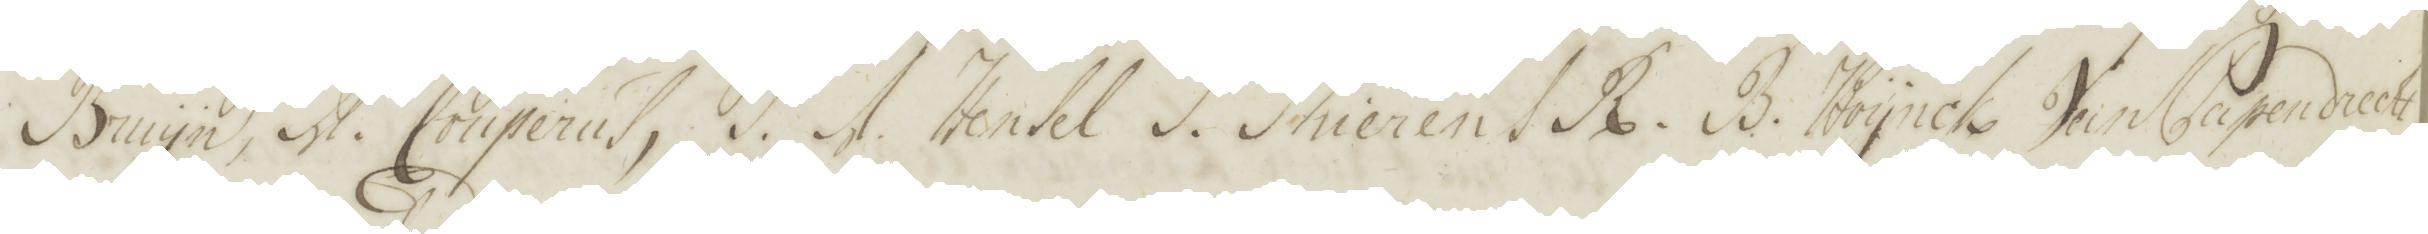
Bruijn, A. Couperus, I. A. Hensel F. Thierens R. B. Hoijnck Van Papendrecht
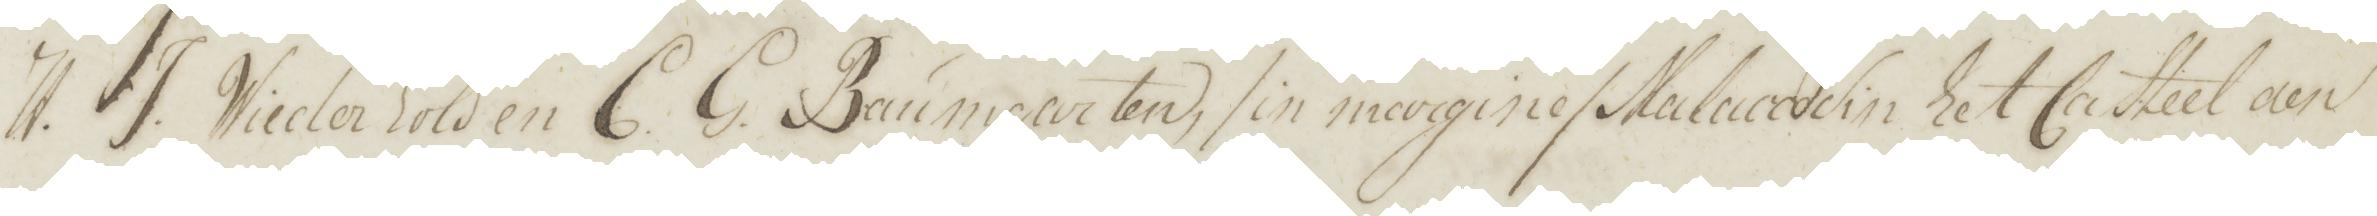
H. I. Wieder hold en C. G. Baumgarten, / in margine/ Malacca in het Casteel den
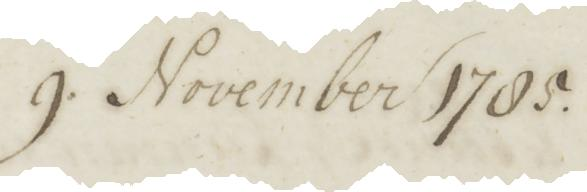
9. November 1785.
